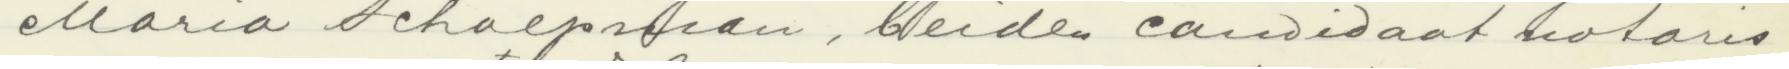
Maria Schaepman, beiden candidaat notaris
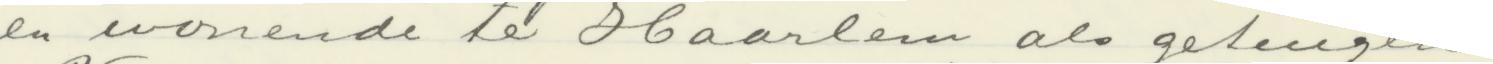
en wonende te Haarlem als getuigen
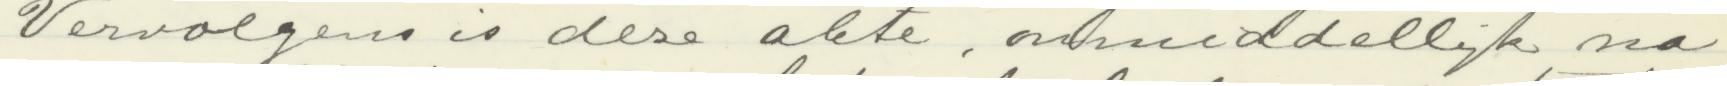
Vervolgens is deze akte, ommiddellijk na
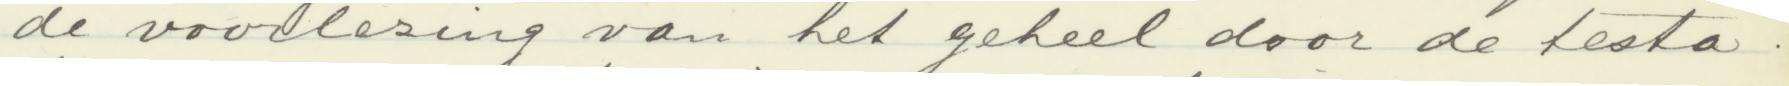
de voorlezing van het geheel door de testa
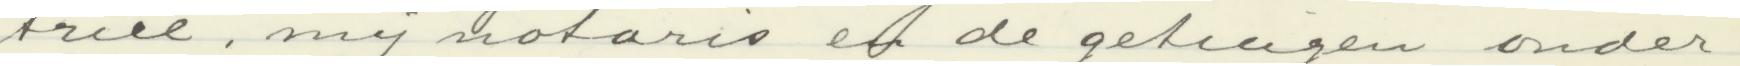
trice, mij notaris en de getuigen onder
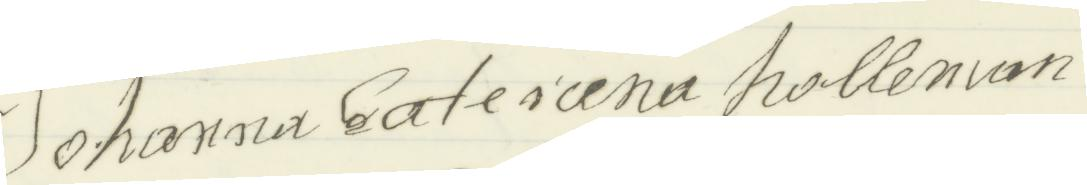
Johanna Cateriena holleman
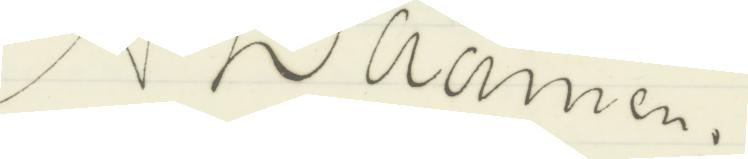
Adaamen.
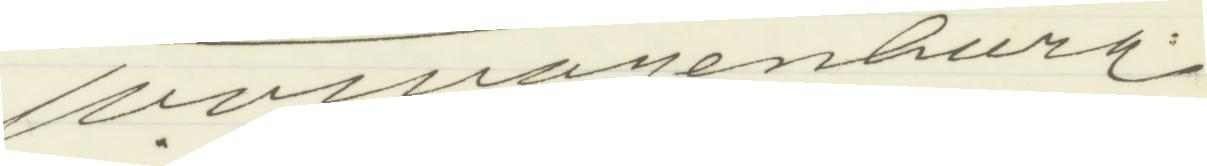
wvwayenburg:
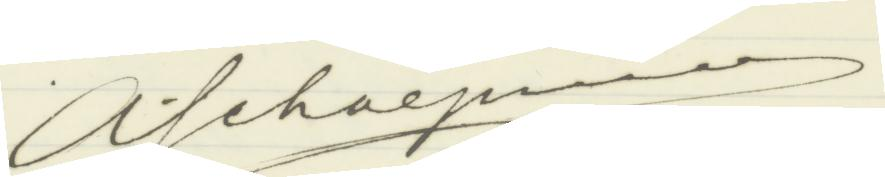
Aschaepman
